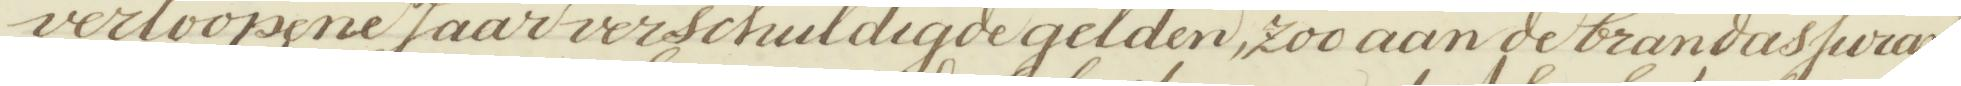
verloopene Jaar verschuldigde gelden, zoo aan de brandassuran
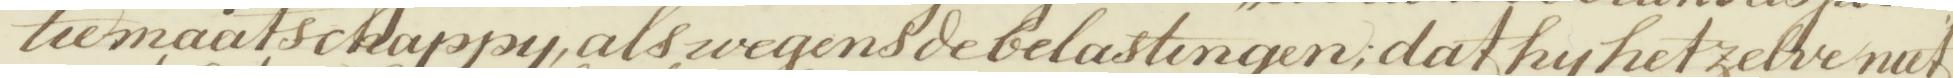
tiemaatschappy, als wegens de belastingen; dat hy hetzelve niet
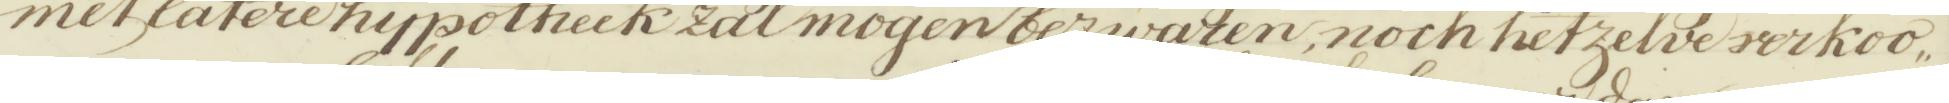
met latere hypotheek zal mogen bezwaren, noch hetzelve verkoo„
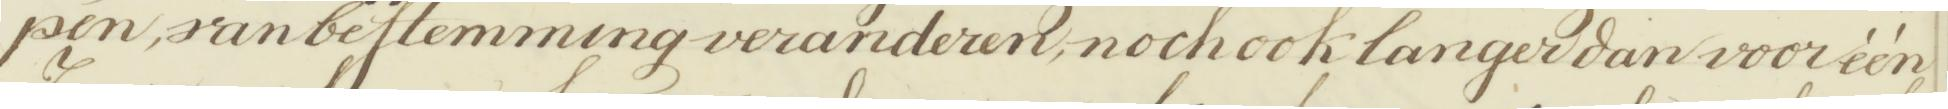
pen, van bestemming veranderen, noch ook langer dan voor één
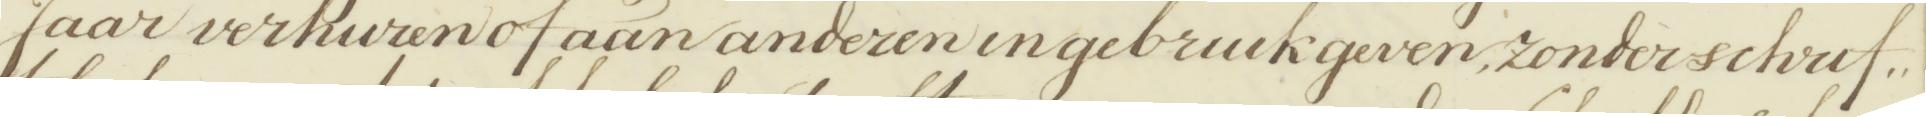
Jaar verhuren of aan anderen ingebruik geven, zonder schrif„
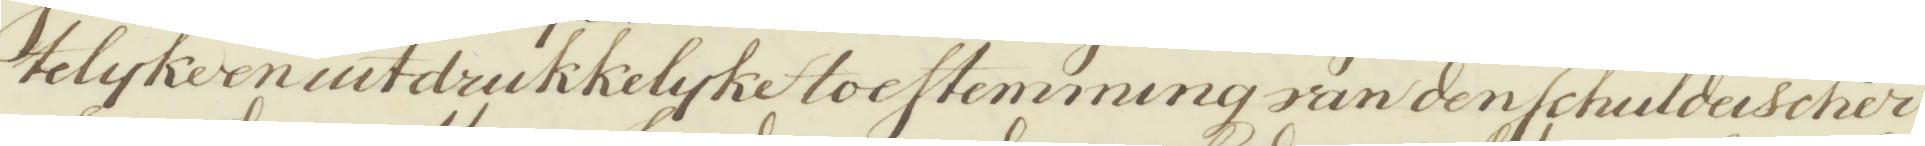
telyke en uitdrukkelyke toestemming van den schuldeischer
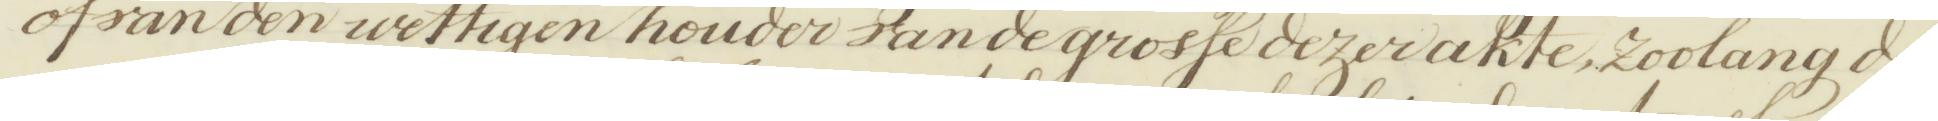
of van den wettigen houder van de grosse dezer akte, zoolang de
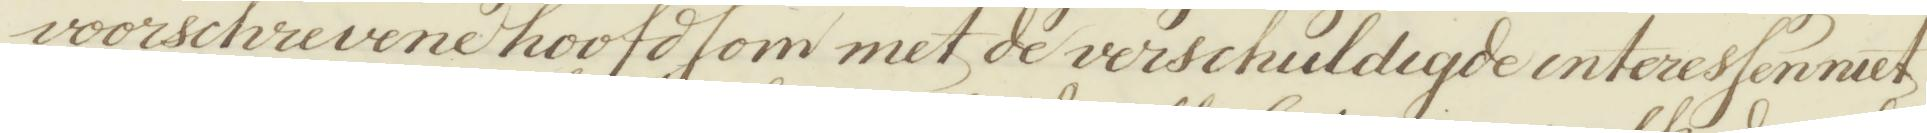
voorschrevene hoofdsom met de verschuldigde interessen niet
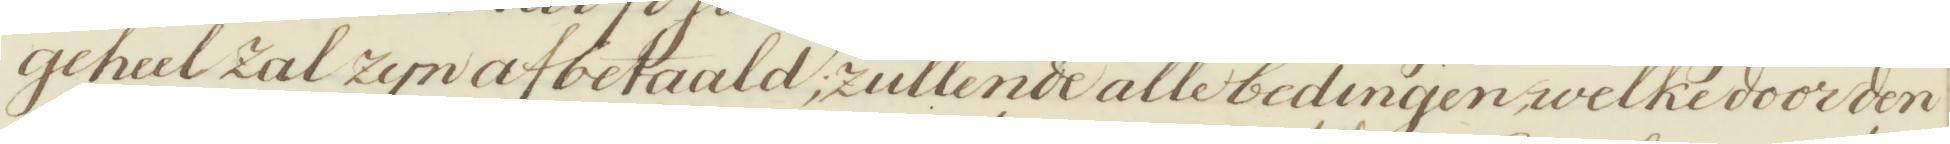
geheel zal zyn afbetaald, zullende alle bedingen, welke door den
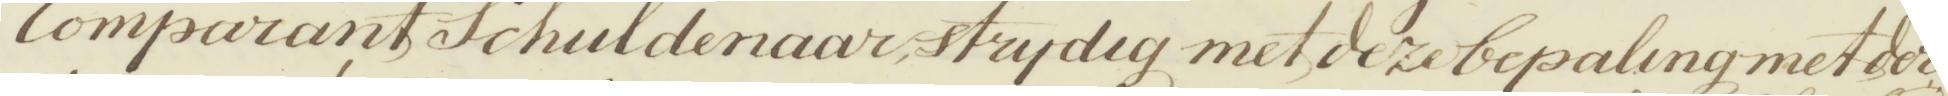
Comparant schuldenaar, strydig met deze bepaling met der
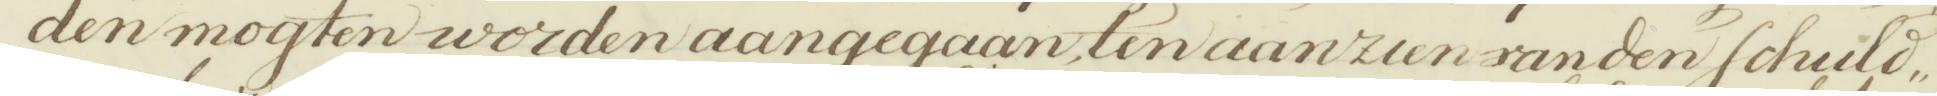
den mogten worden aangegaan, ten aanzien van den schuld„
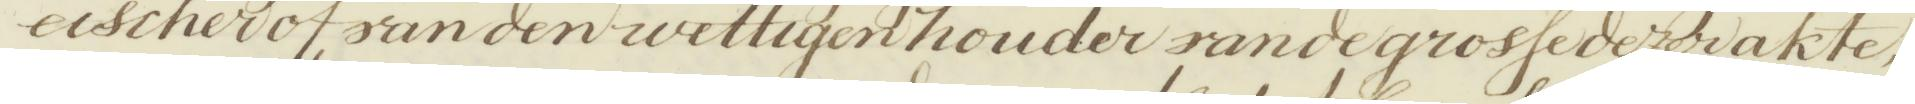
eischer of van den wettigen houder van de grosse dezer akte,
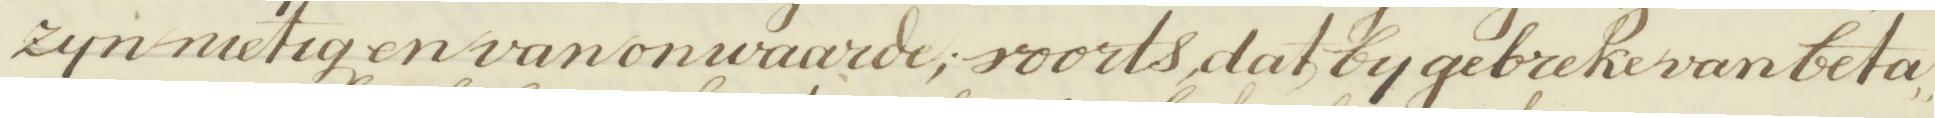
zyn nietig en van onwaarde; voorts, dat by gebreke van beta„
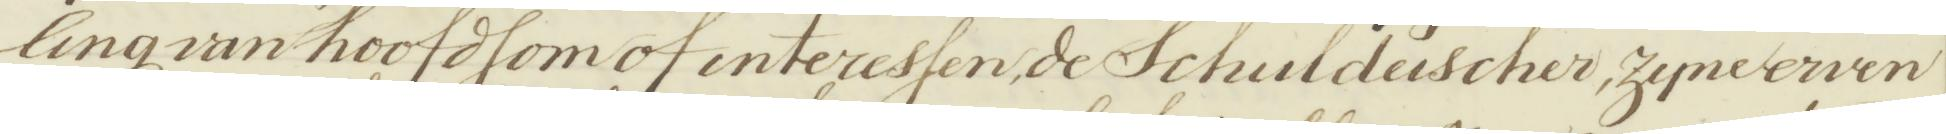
ling van hoofdsom of interessen, de Schuldeischer, zyne erven
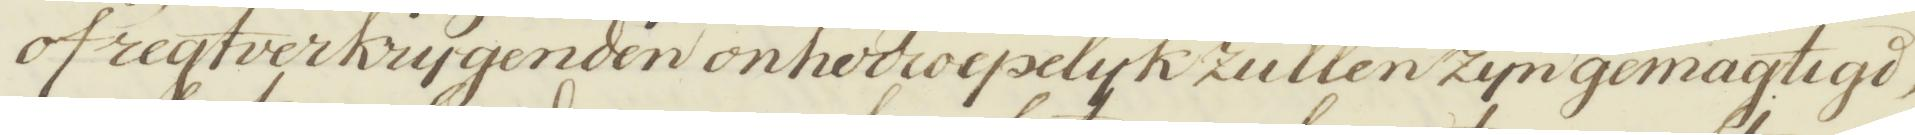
of regtverkrygenden onherroepelyk zullen zyn gemagtigd
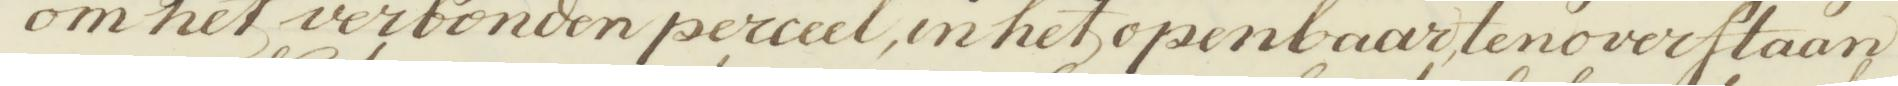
om het verbonden perceel, in het openbaar, ten overstaan
